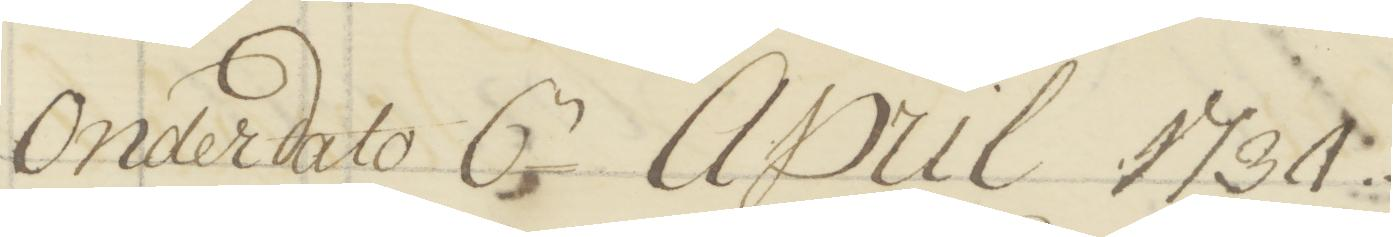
Onder dato 6=' April 1734.
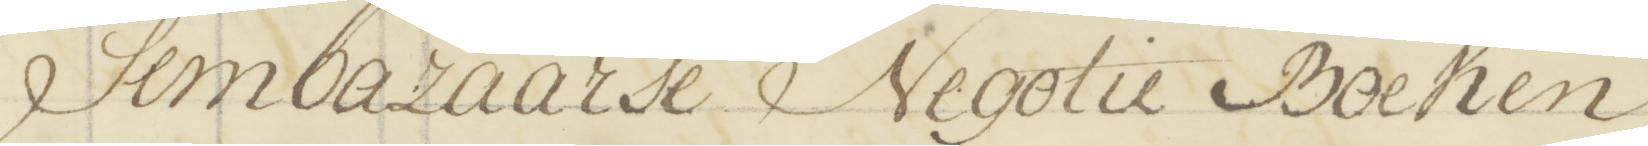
Sembazaarse Negotie Boeken
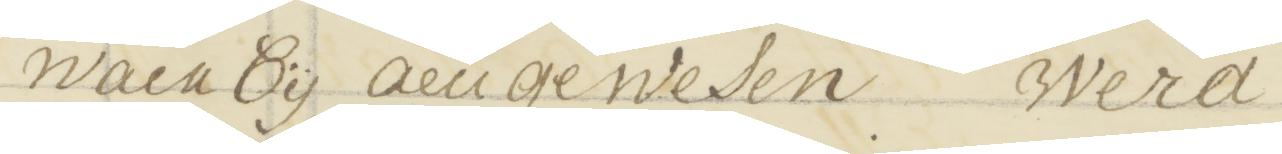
waerbij aengewesen werd
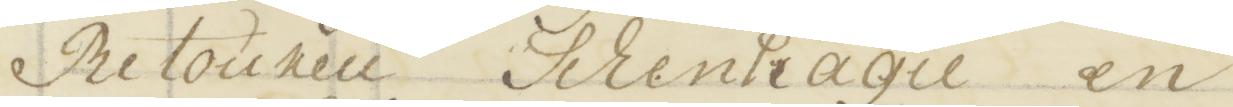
Retouren schenkagie en
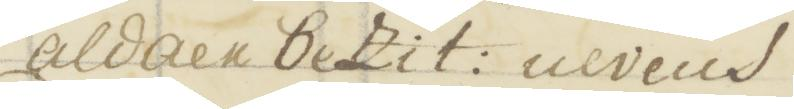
aldaer bezit: nevens
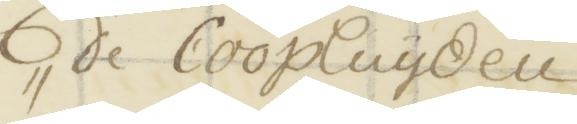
de Coopluijden
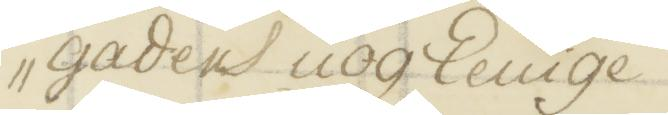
„gaders nog Eenige
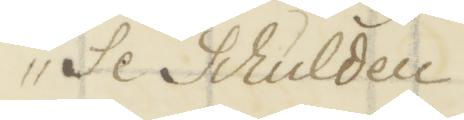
„se schulden
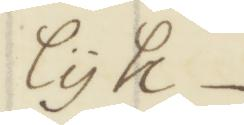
lijk —
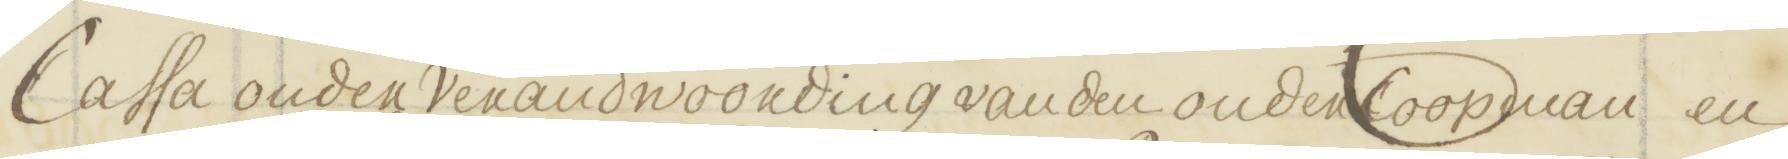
Cassa onder verandwoording van den ondercoopman en
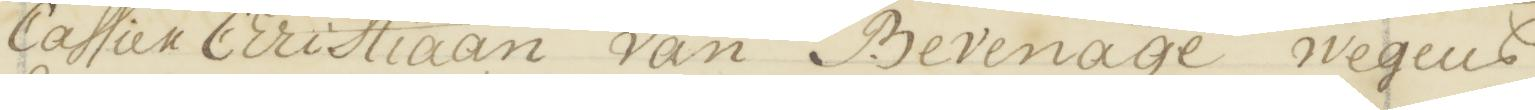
Cassier Christiaan van Bevenage wegens
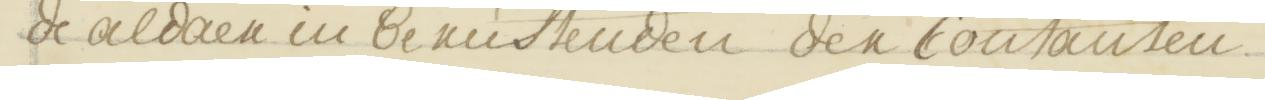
de aldaer in berustenden der contanten
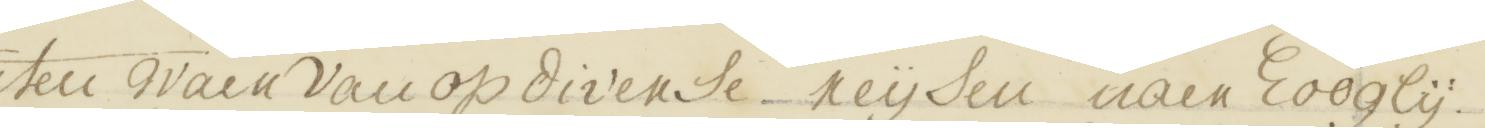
Contanten waer van op diverse reijsen naer hooglij.
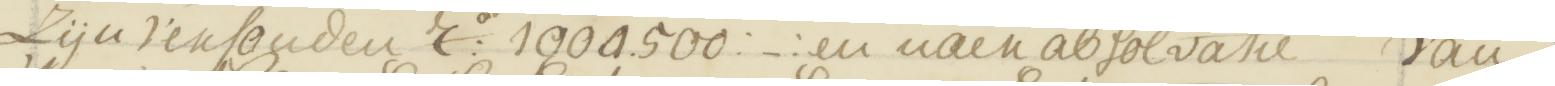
zijn versonden r:/o 1004.500 : – : en naer absolvatie van
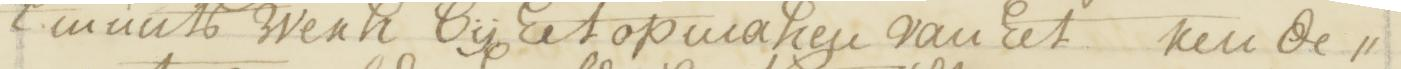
't munts werk bij het opmaken van het rende„
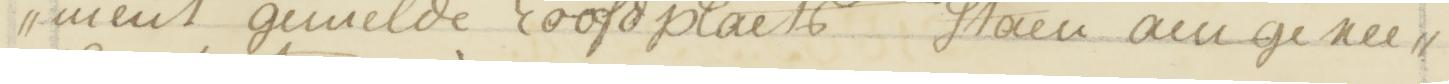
„ment gemelde hoofdplaets staen aengeree„
